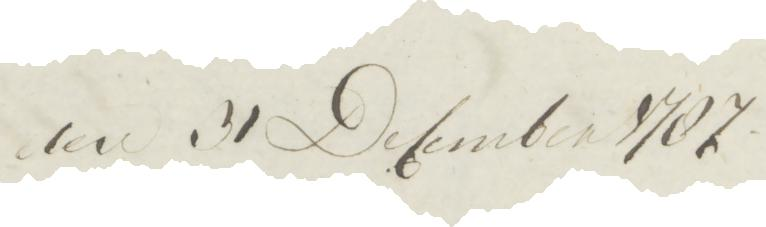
den 31 December 1787
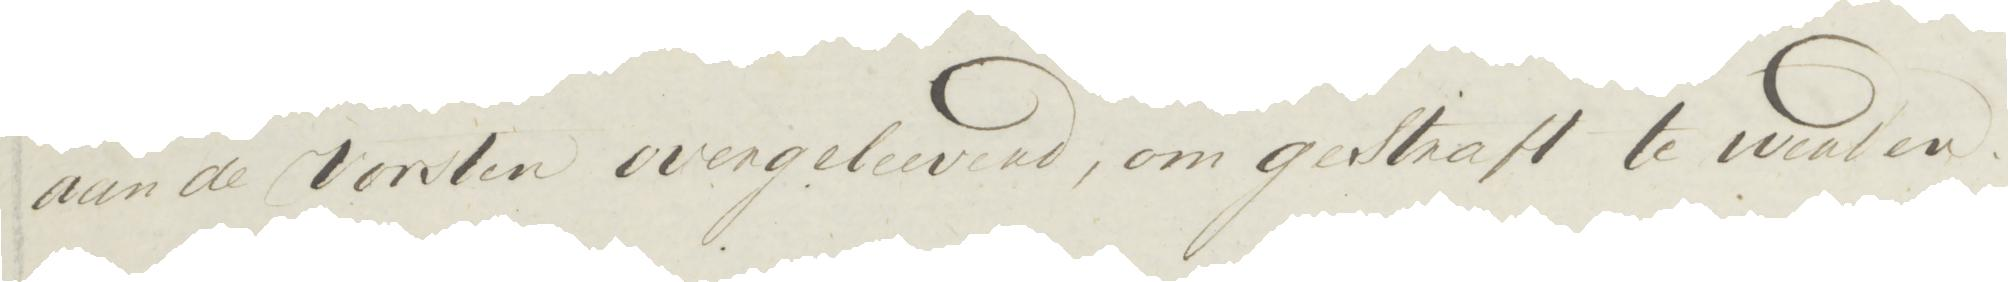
aan de vorsten overgeleeverd, om gestraft te werden.
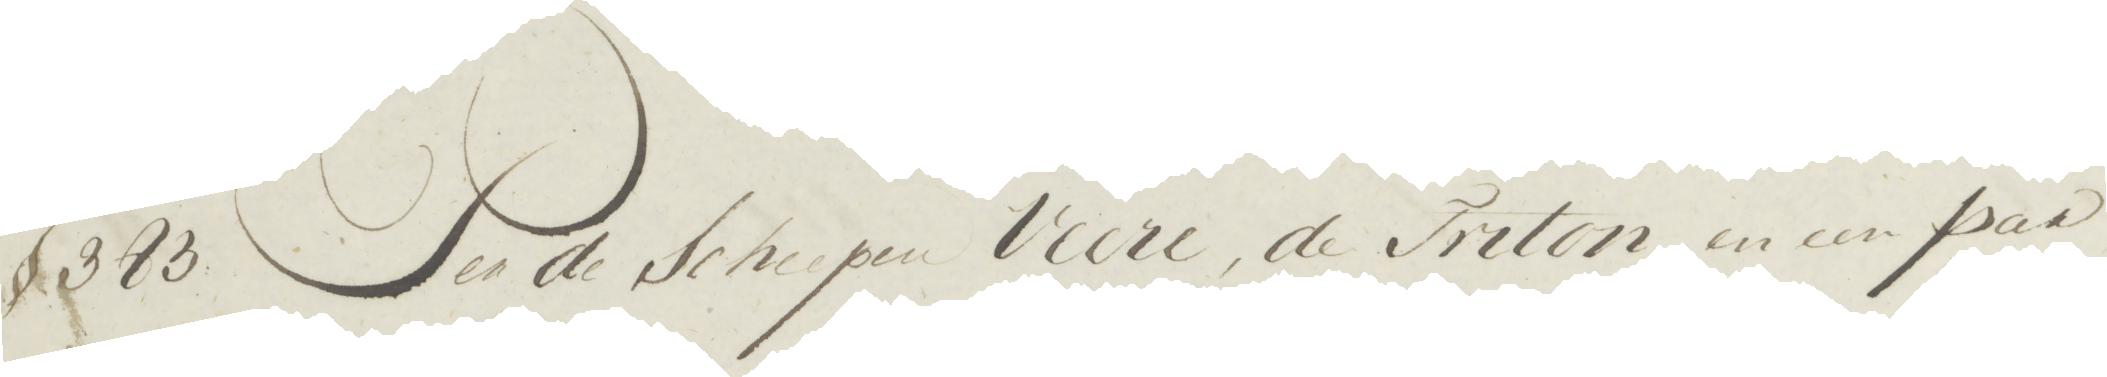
§ 383 Per de scheepen Veere, de Triton en een par
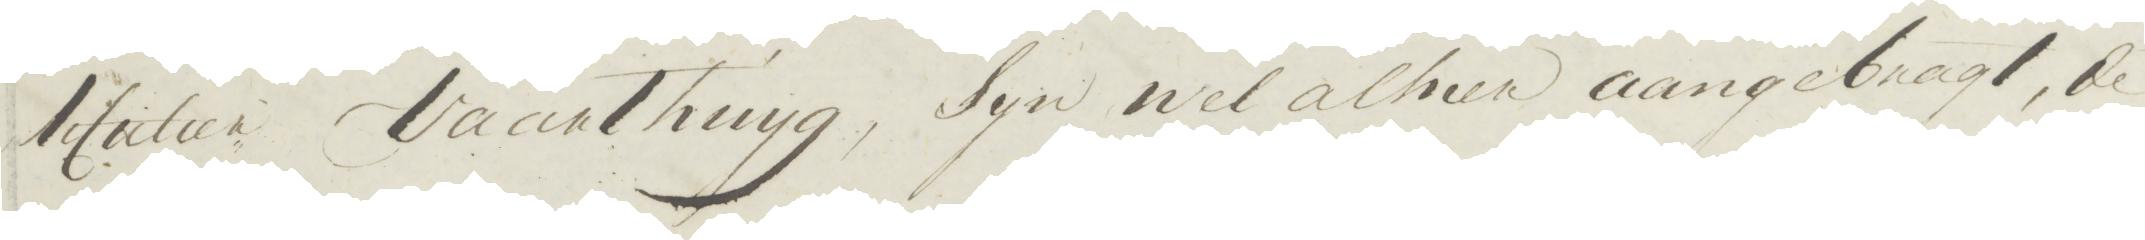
ticulier vaarthuijg, syn wel alhier aangebragt, de
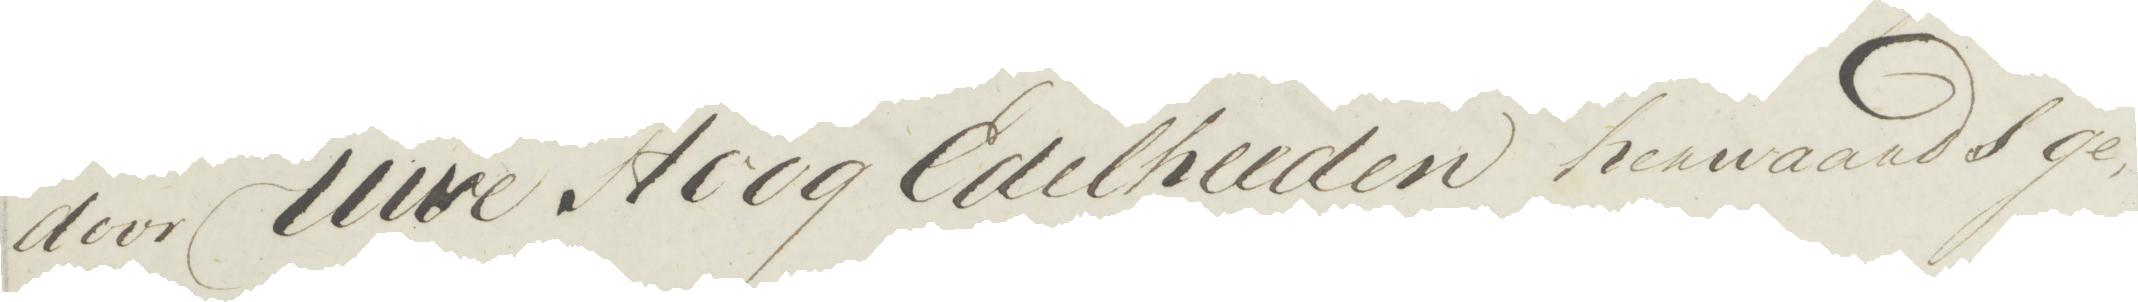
door uwe Hoog Edelheeden herwaards ge,
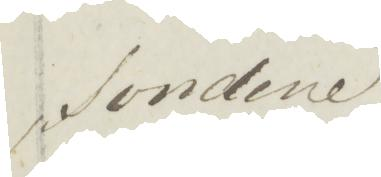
„sondene
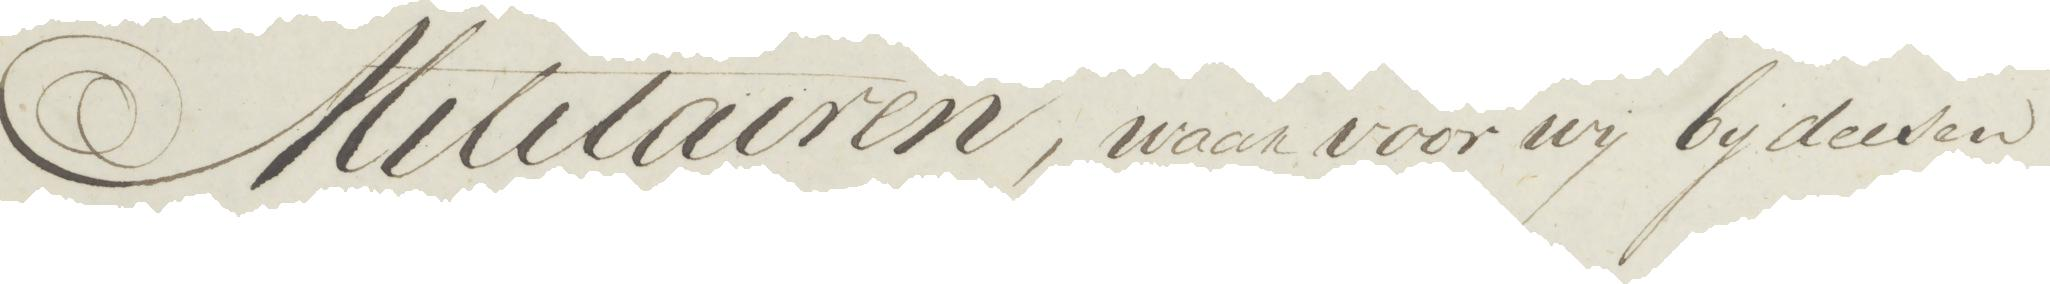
Militairen, waar voor wij by deesen
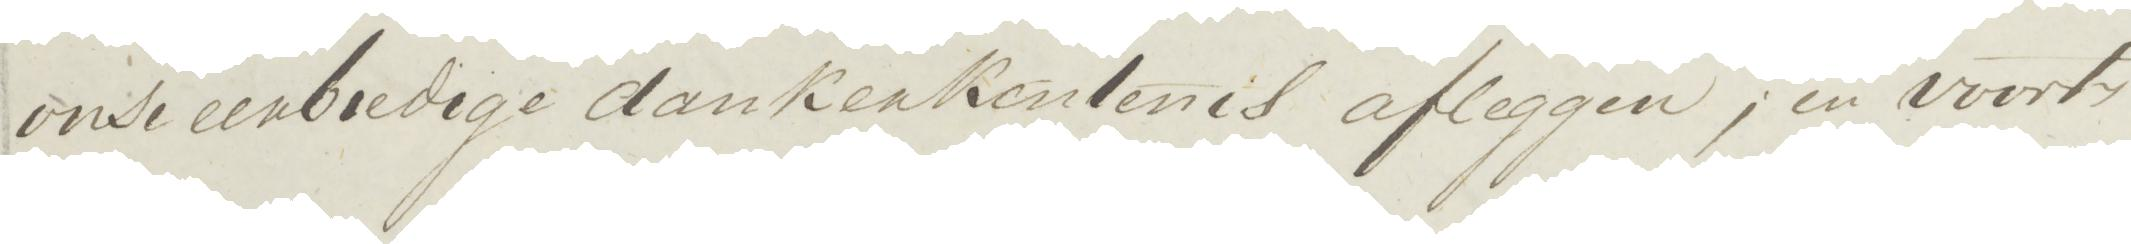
onse eerbiedige dankerkentenis afleggen; en voorts
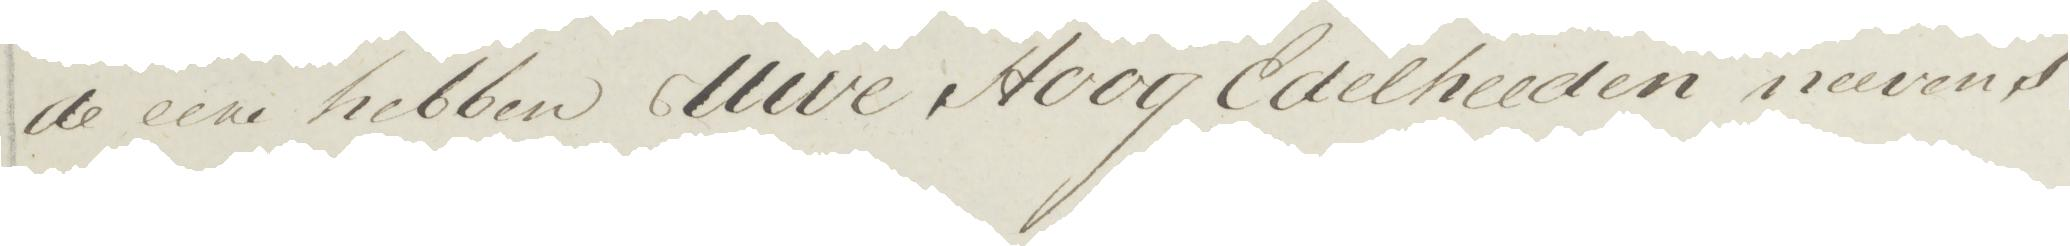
de eere hebben uwe Hoog Edelheeden neevens
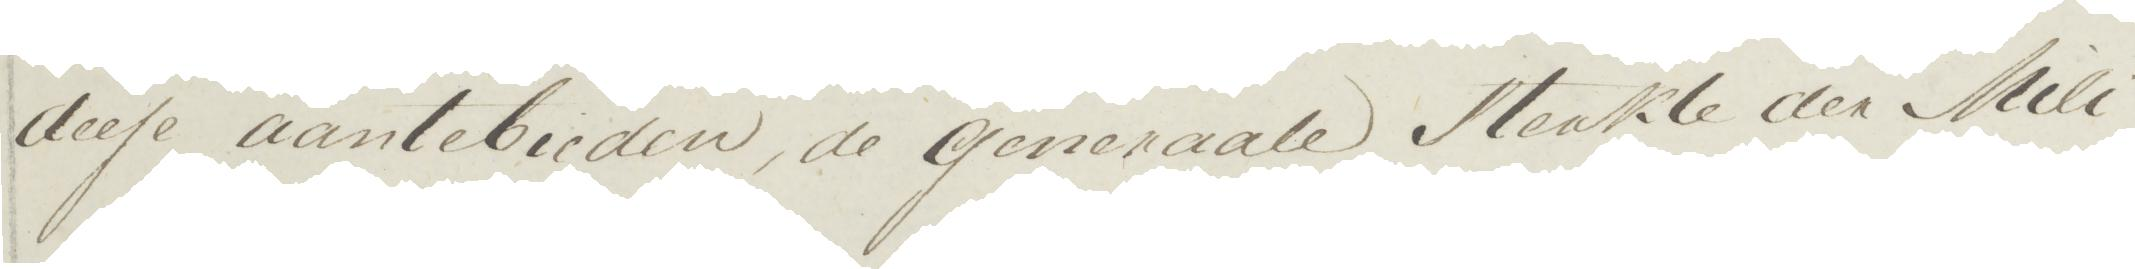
deese aantebieden, de generaale sterkte der Mili„
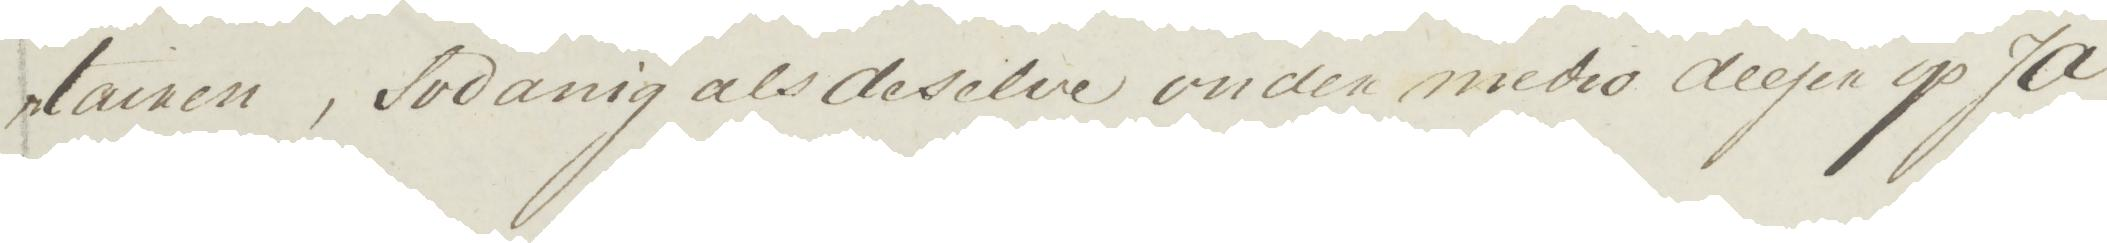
tairen, sodanig als deselve onder medio deeser op Ja
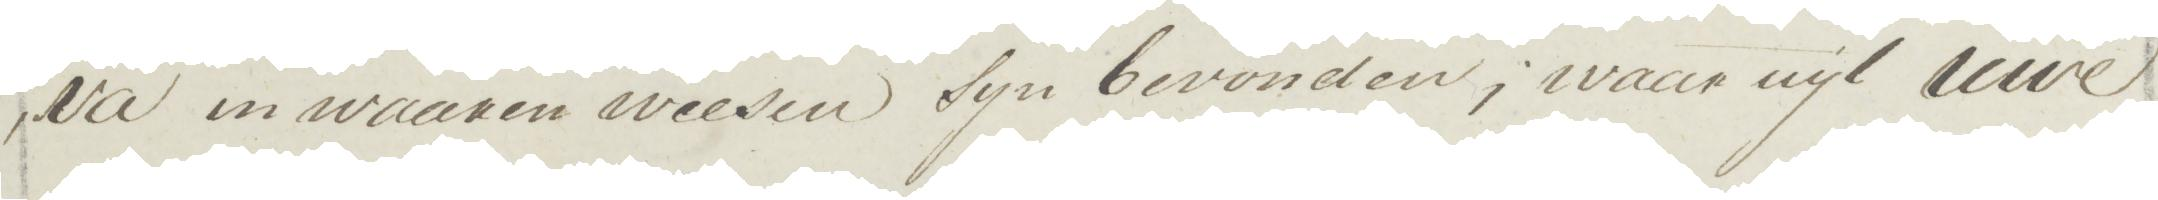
,va in waaren weesen sijn bevonden; waar uijt uwe
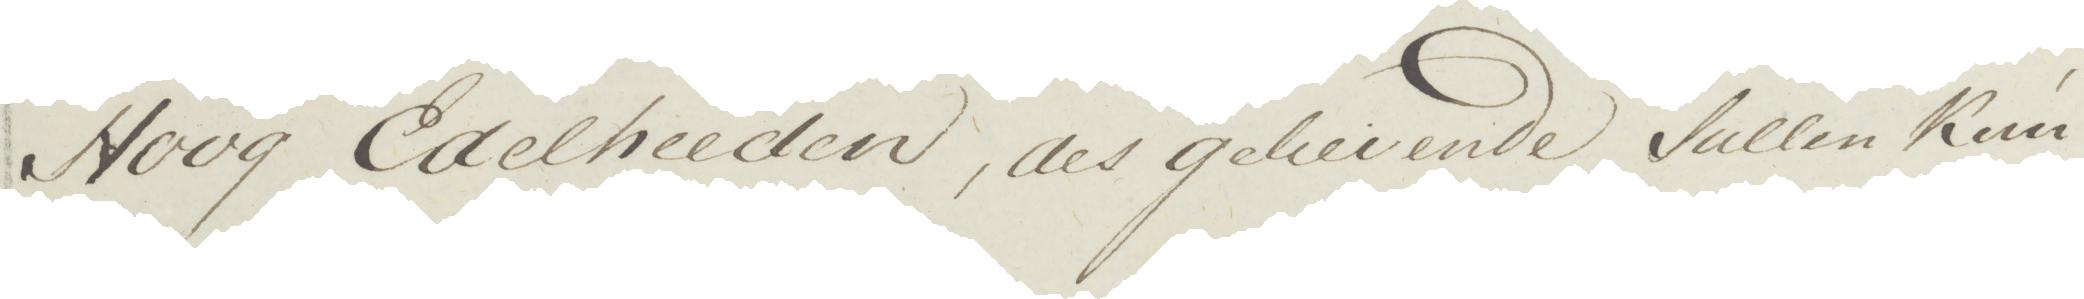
Hoog Edelheeden, des gelievende sullen kun
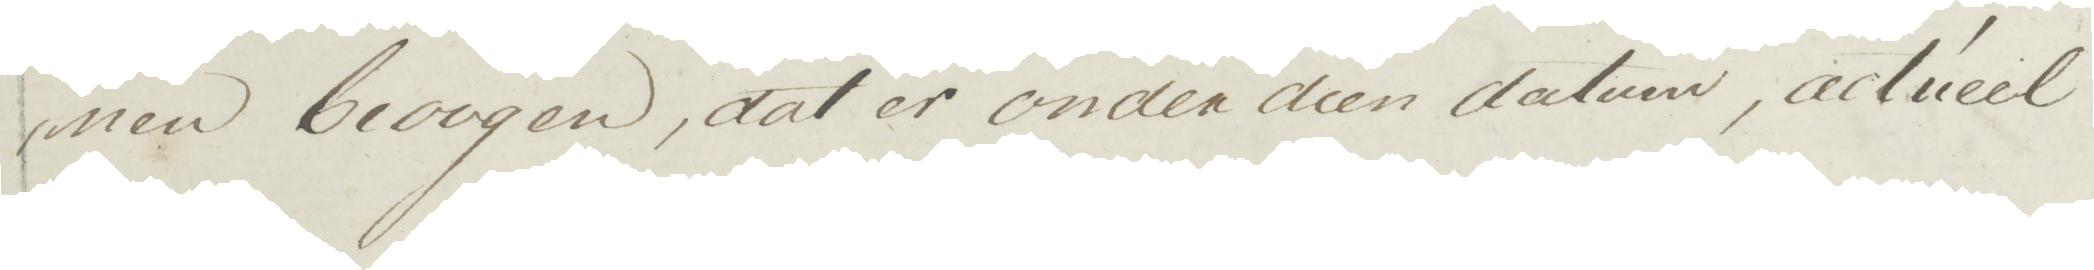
„nen beoogen, dat 'er onder dien datum, actueel
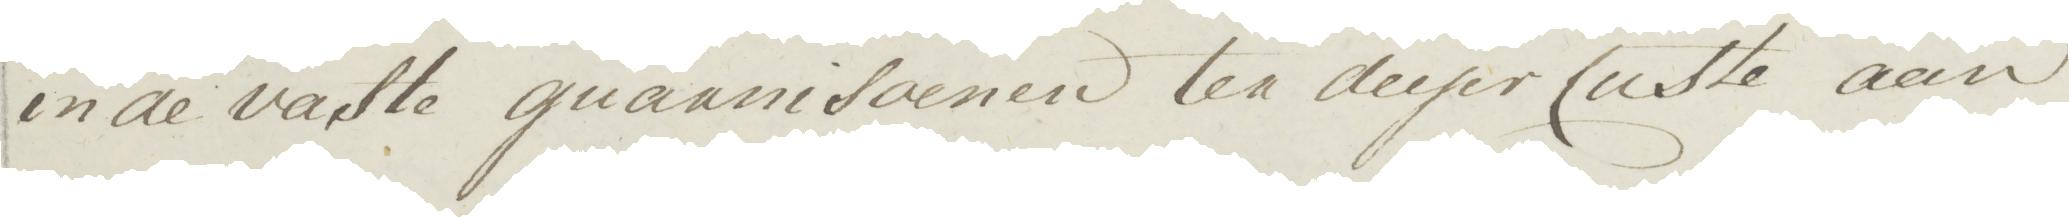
in de vaste guarnisoenen ter deeser Custe aan
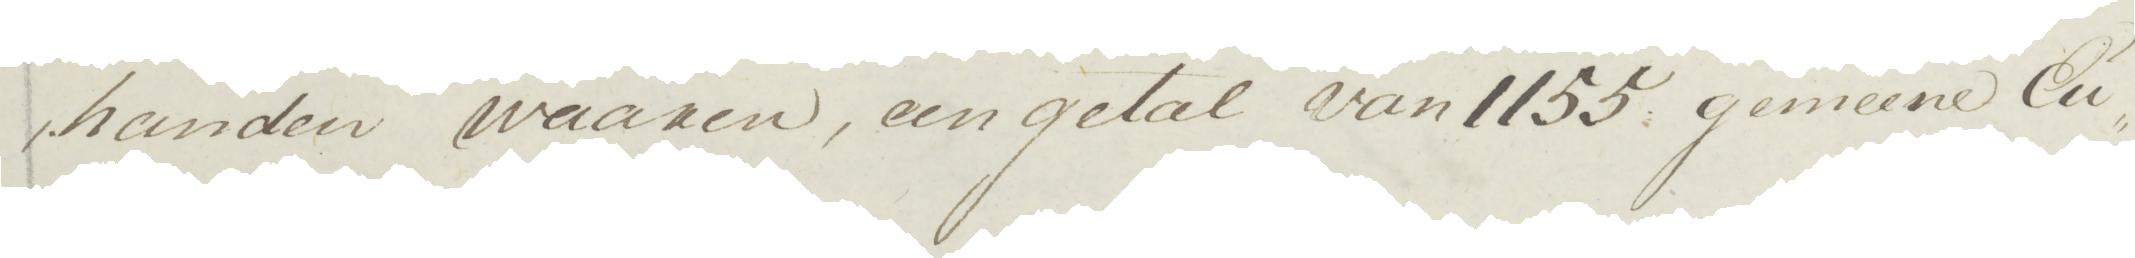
„handen waaren, een getal van 1155: gemeene Eu
